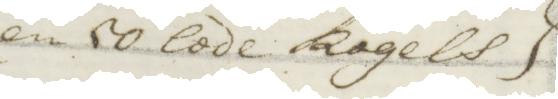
en 50 lode kogels
